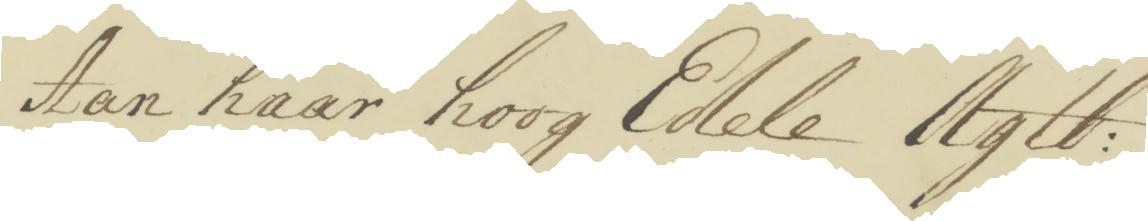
Aan haar hoog Edele Agtb:
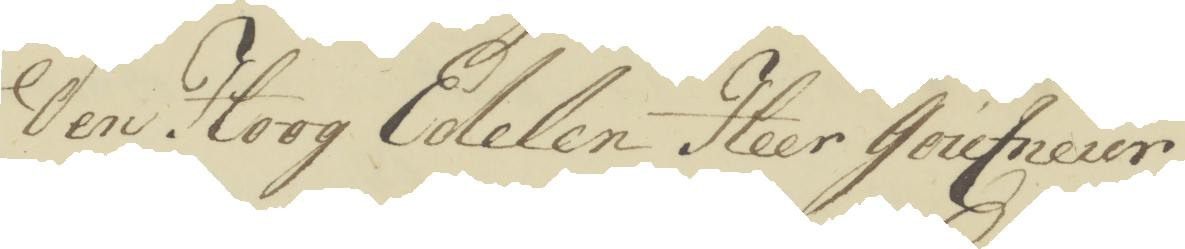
den Hoog Edelen Heer Goufneur
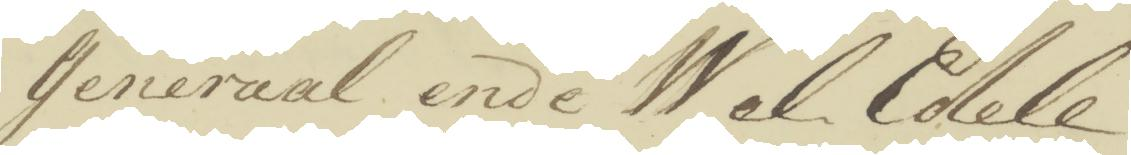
Generaal ende Wel Edele
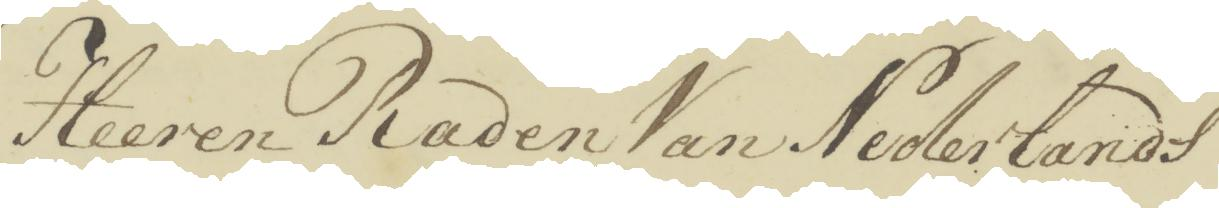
Heeren Raden Van Nederlands
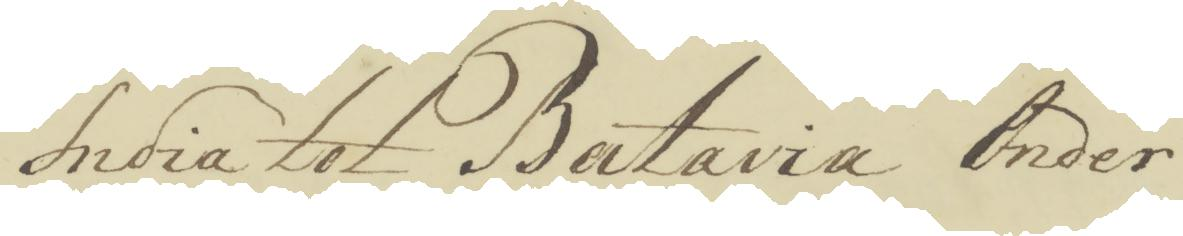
India tot Batavia Onder
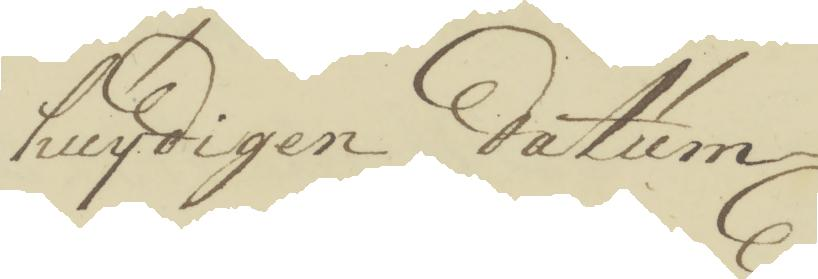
huydigen datum
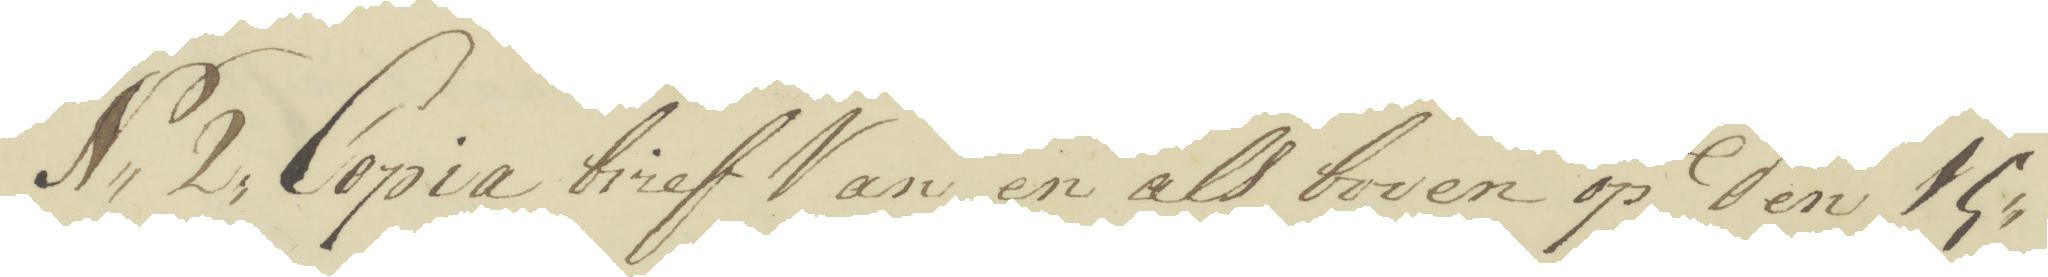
N„ 2; Copia brief Van en als boven op den 15„
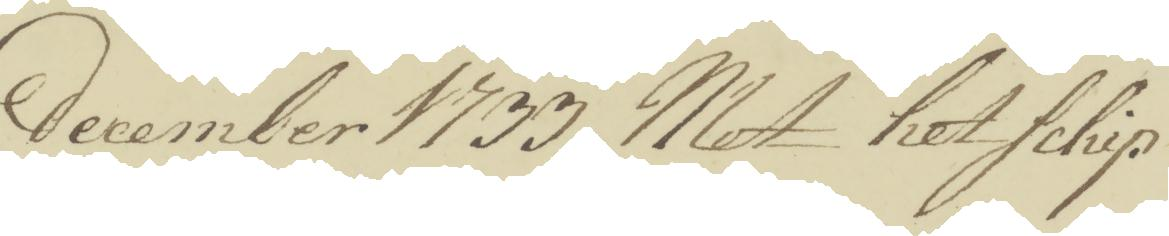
december 1733. Met het schip
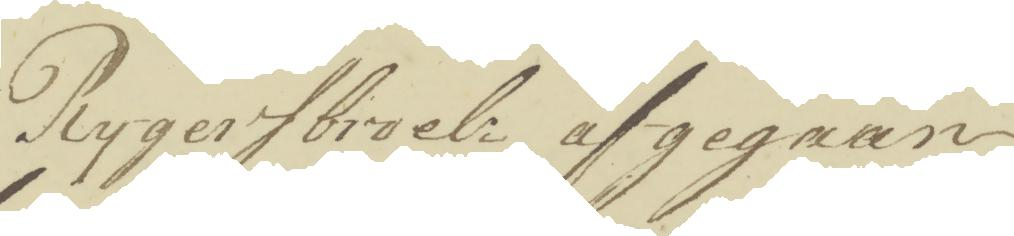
Rygersbroek afgegaan
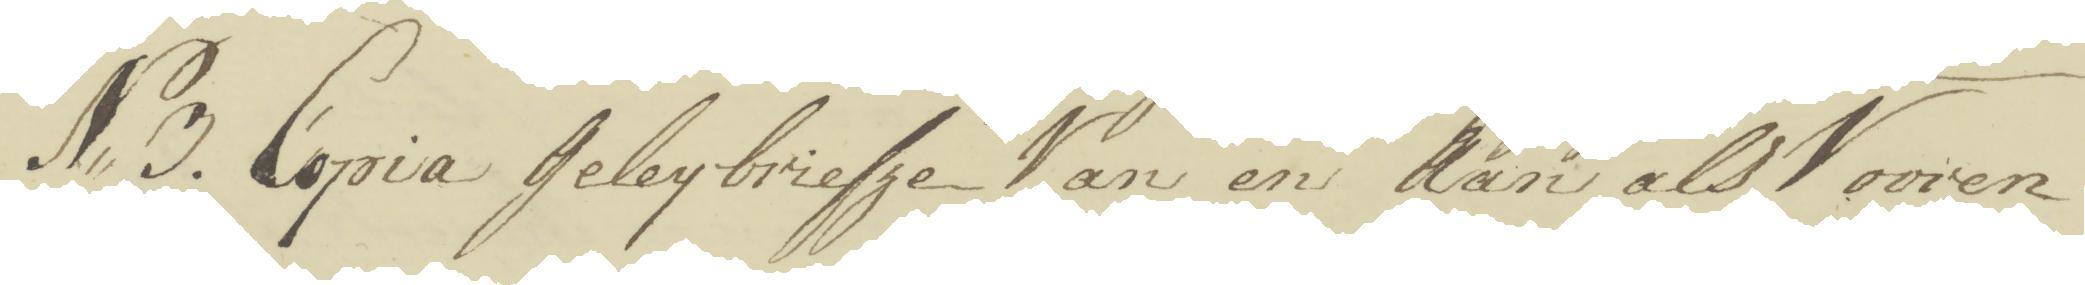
N„ 3. Copia Geleybriefje Van en Aan als Vooren
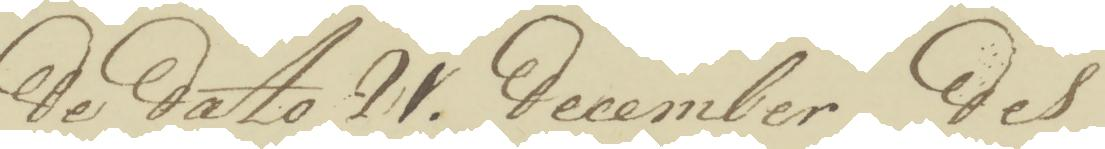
de dato 21. december des
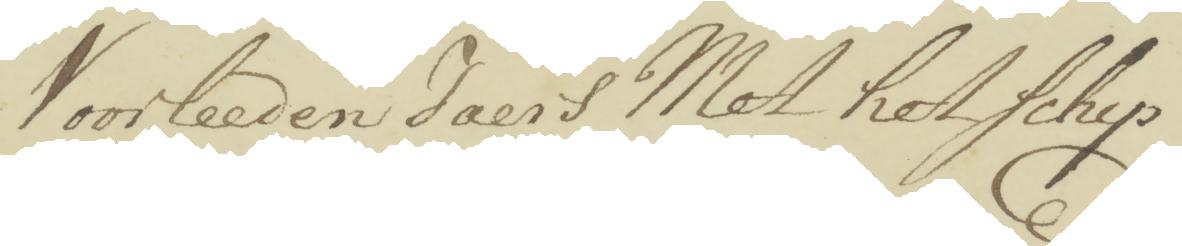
Voorleeden Jaers Met het schip
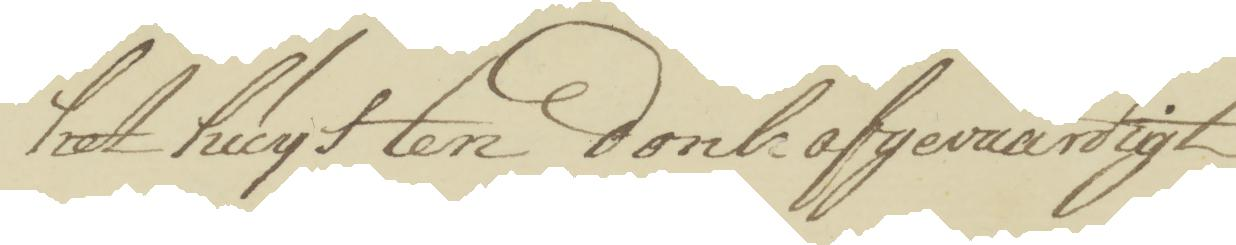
het huys ten donk afgevaardigt
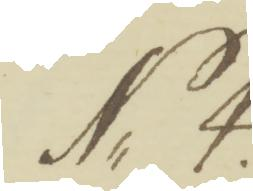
N„ 4
